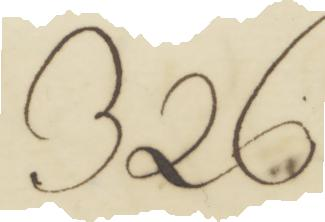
326
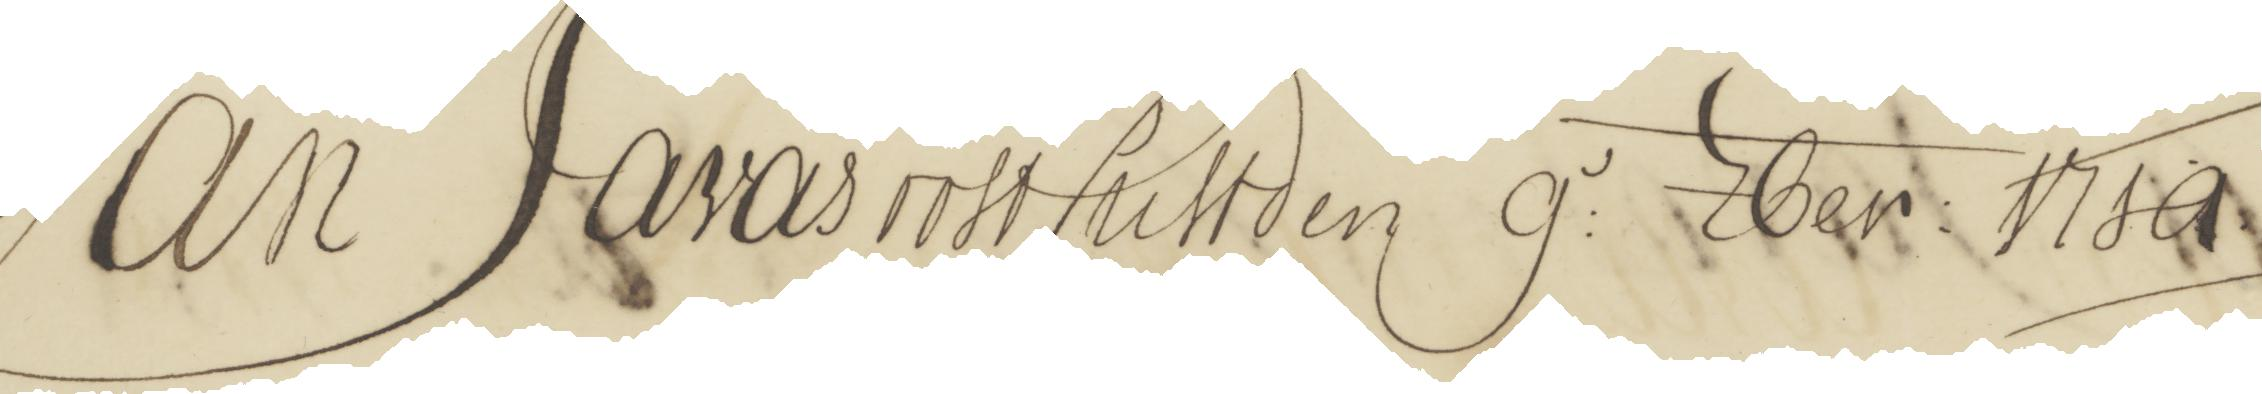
Van Javas oost Cust den 9:' 7ber: 1714
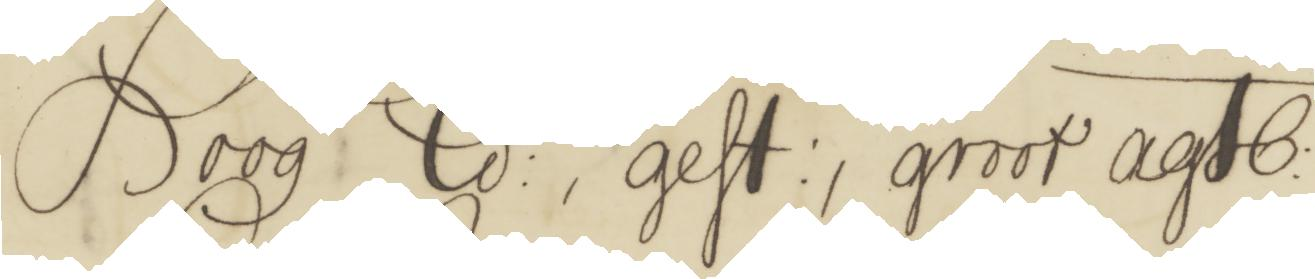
Hoog Ed:le, gest:, groot agtb:
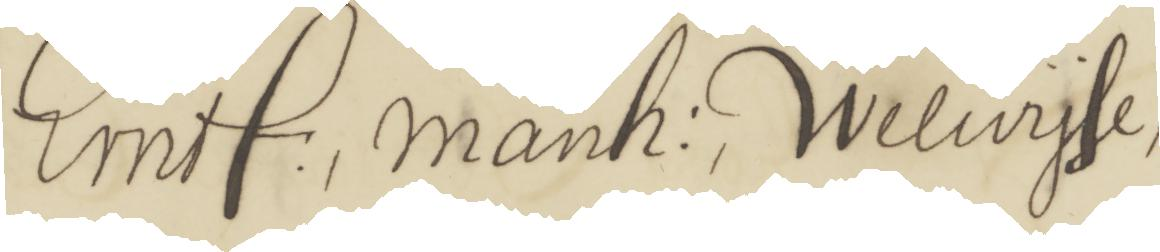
Erntf:, manh:, welwijse
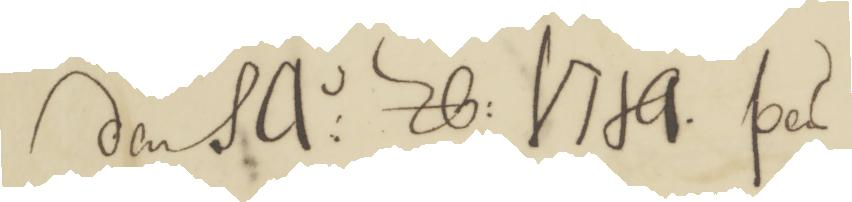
den 14:' 7b: 1714. per
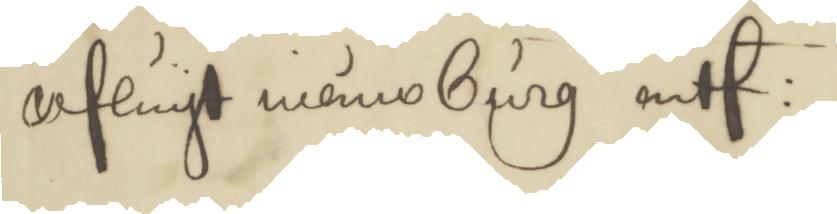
de fluijt nieuwburg ontf:
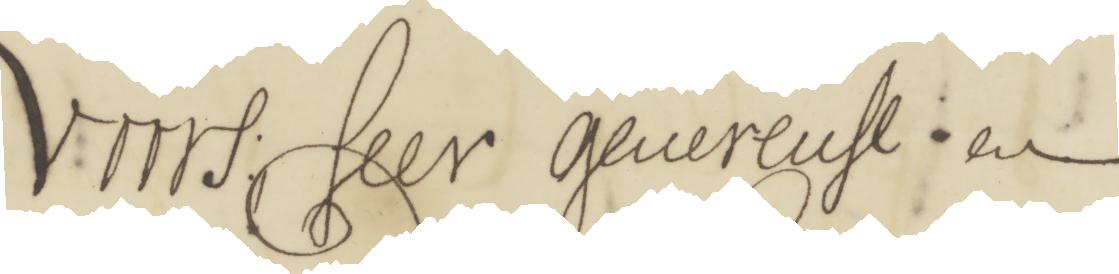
voors:, seer genereuse en
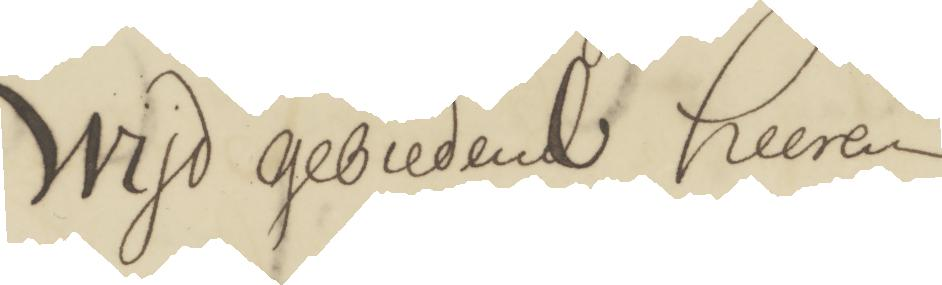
wijd gebiedende heeren
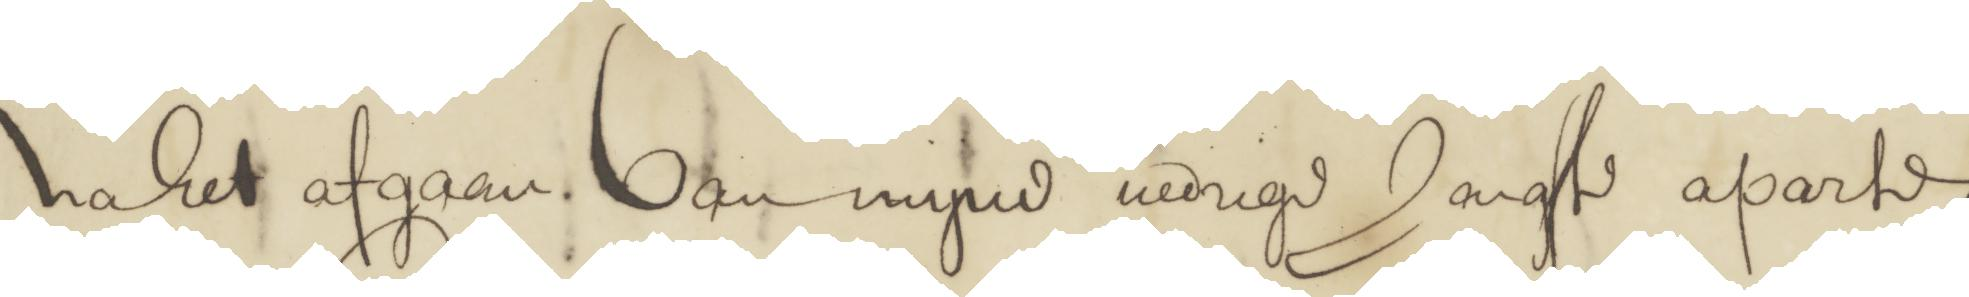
na het afgaan van mijne nedrige Jongste aparte
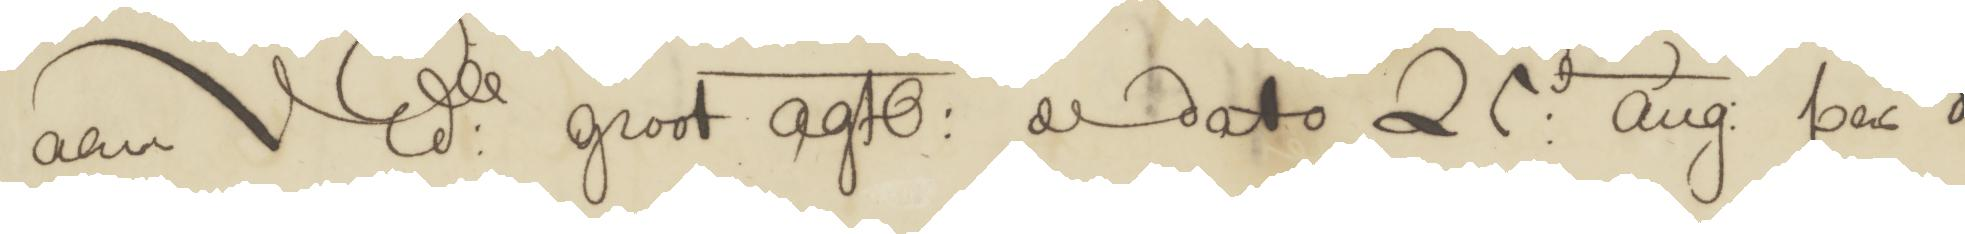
aan VEd:le groot agtb: de dato 25:e aug: per
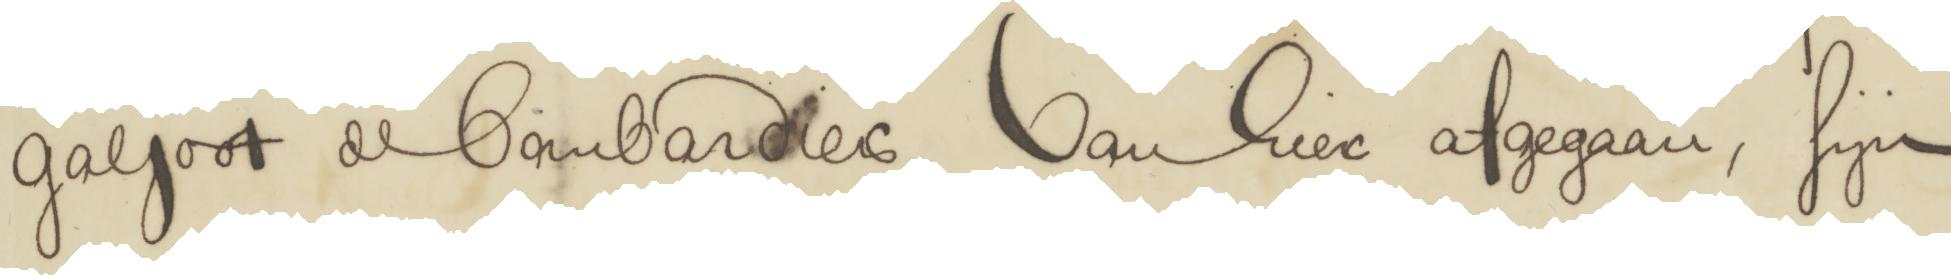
galjoot de bombardier van hier afgegaan, sijn
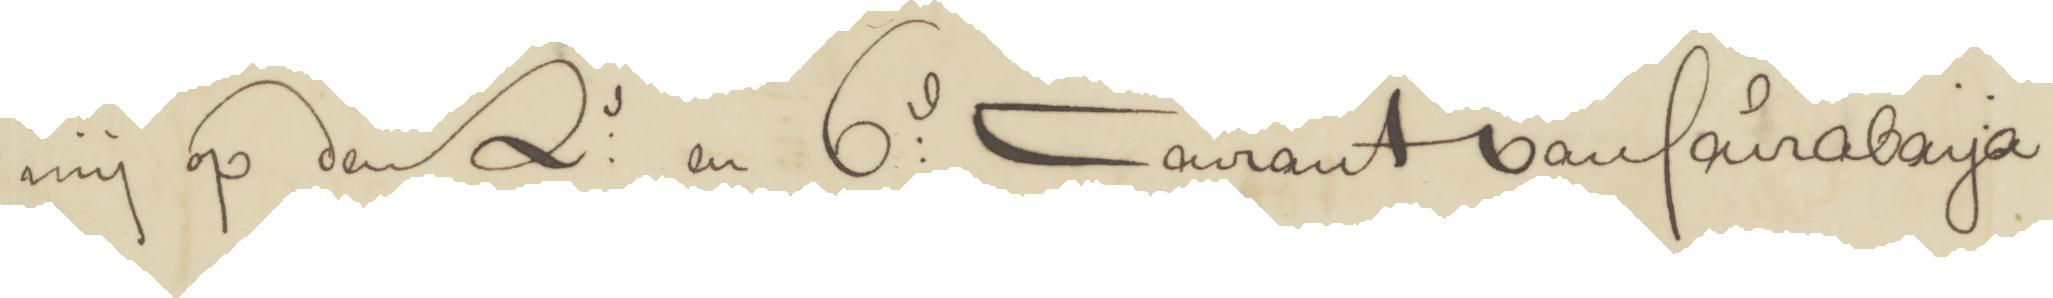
mij op den 2:e en 6:e Courant van sourabaija
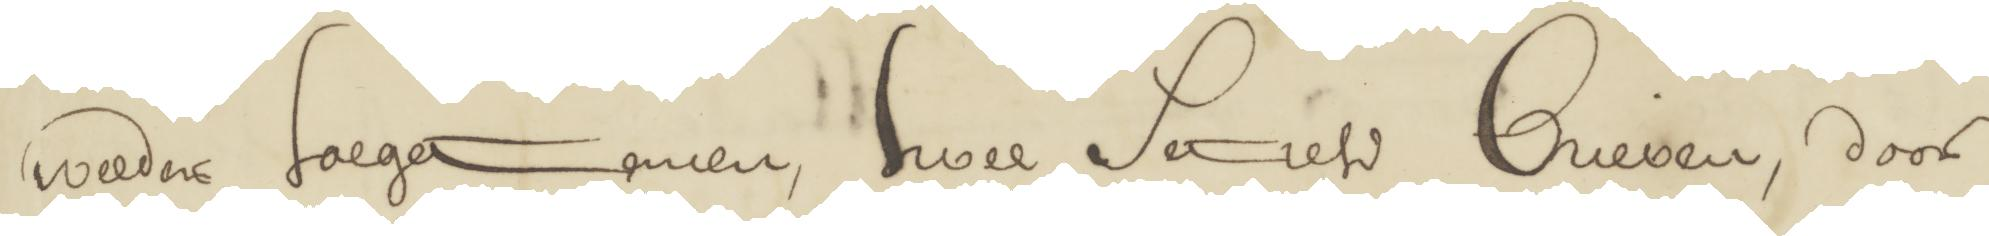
weeder toegecomen, twee secrete brieven, door
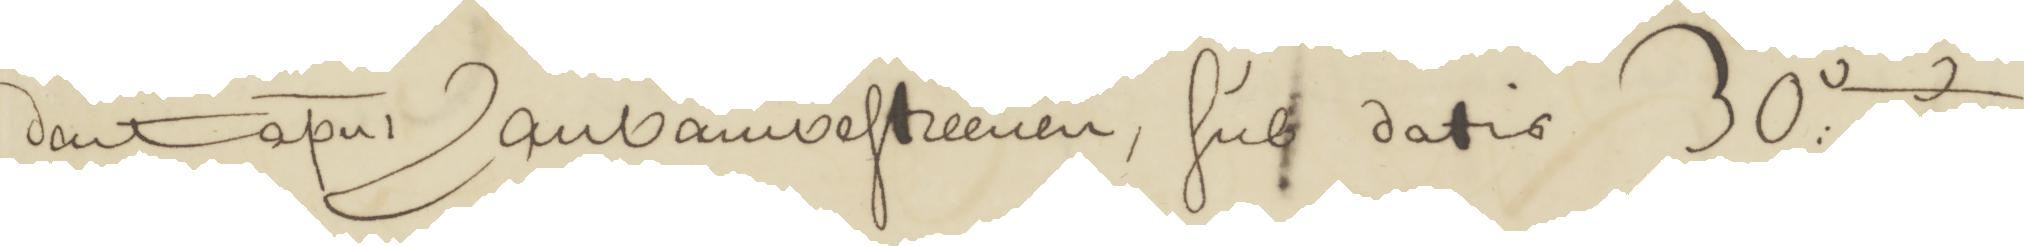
den Capn: Jan van westreenen, sub datis 30:' aug
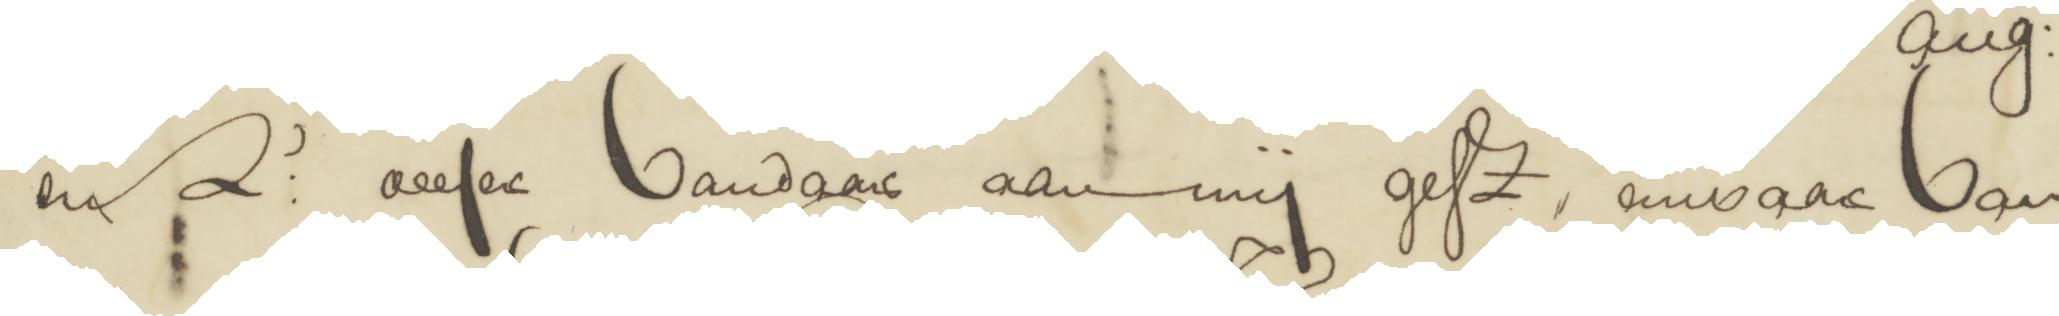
en 2:' deser vandaar aan mij gesz„ en waar van
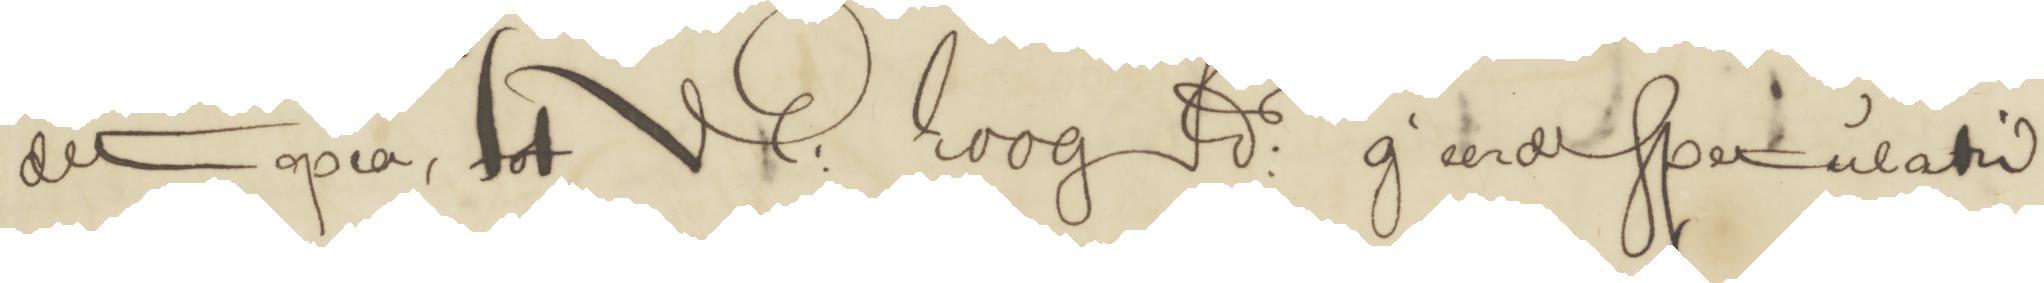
de Copia, tot VE: hoog Ed:s g’eerde speculatie
